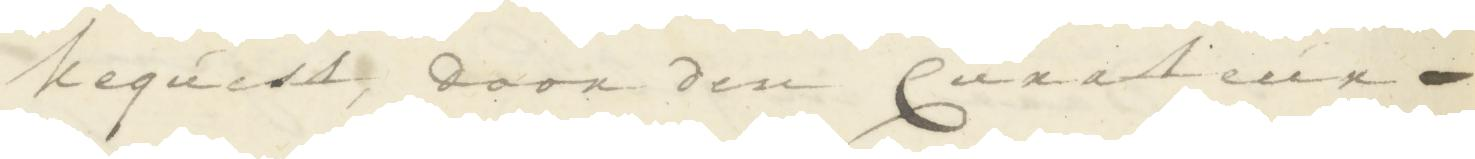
request, door den curateur —
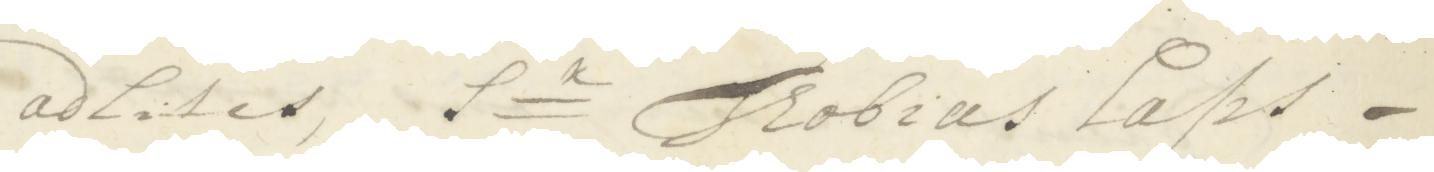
ad lites, s=r Thobias Laps —
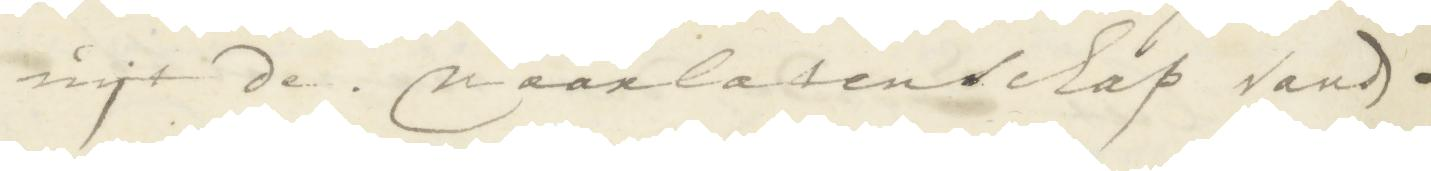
uijt de naarlatenschap vand
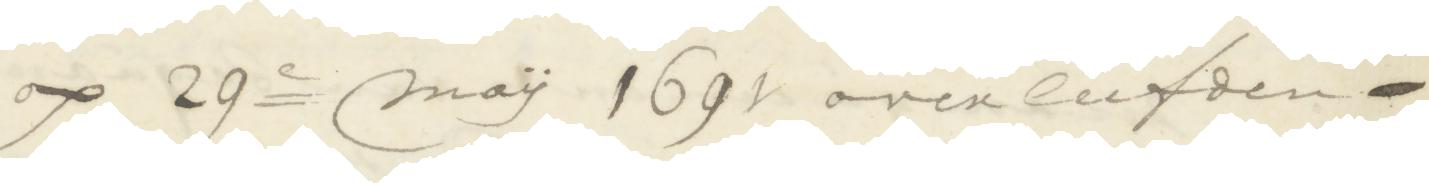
op 29=e maij 1691 overleefden —
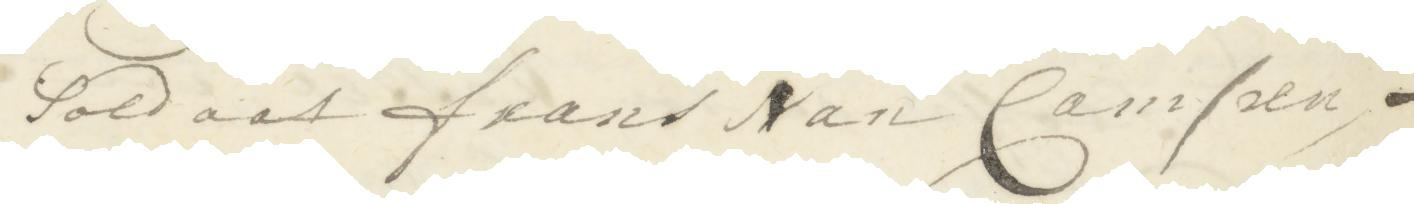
soldaat frans van Campen, —
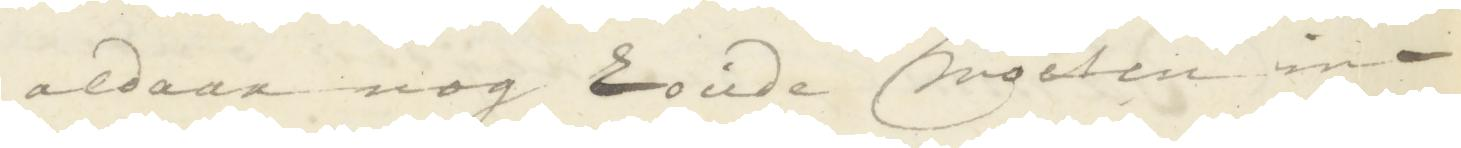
aldaar nog zoude moeten in —
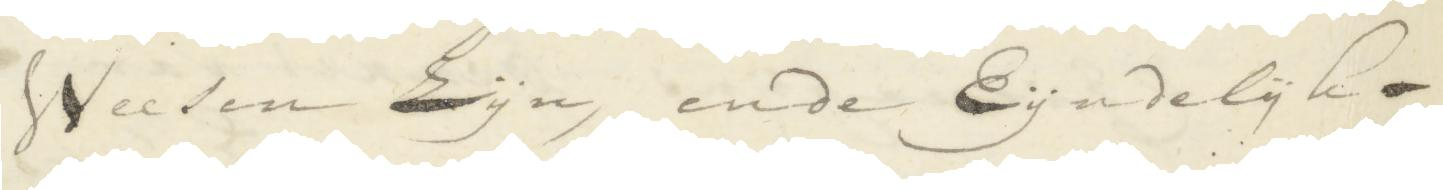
weesen zijn, ende Eijndelijk —
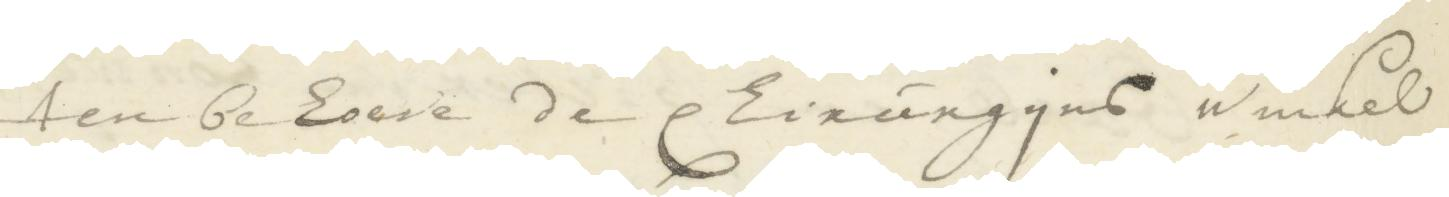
ten behoeve de chirurgijns winkel
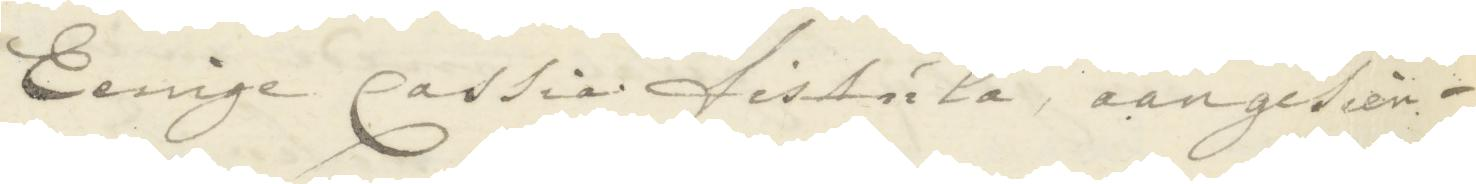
Eenige cassia fistula, aangesien —
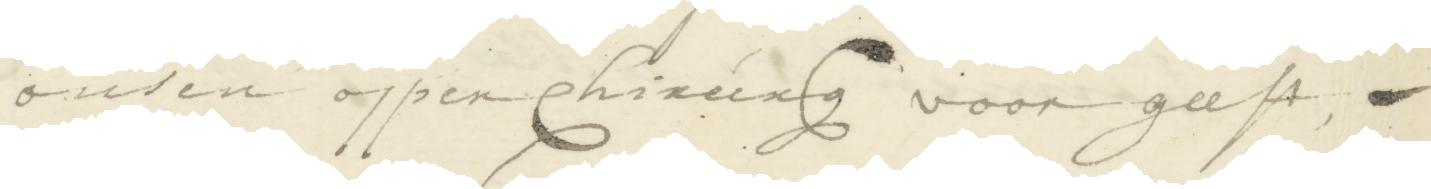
onsen opperchirurg voor geeft, —
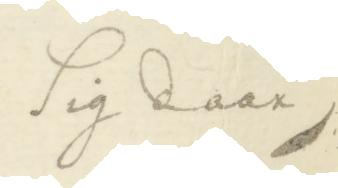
sig daar
